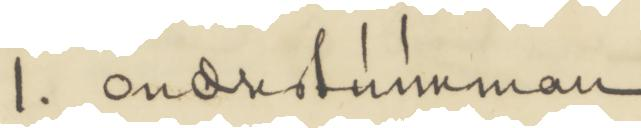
1. onderstuurman
